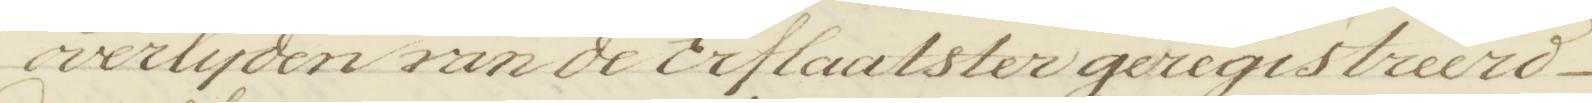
overlyden van de Erflaatster geregistreerd-
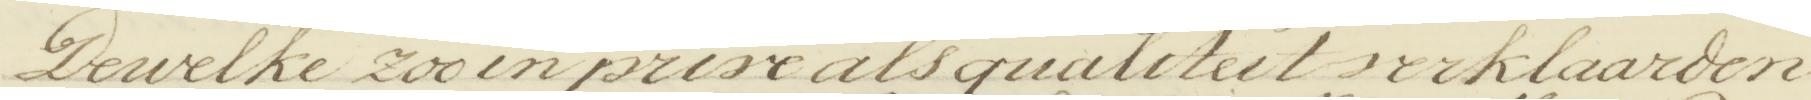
Dewelke zoo in privé als qualiteit verklaarden
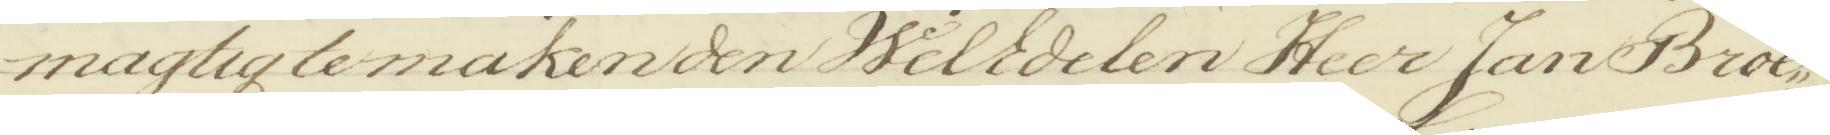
magtig te maken den WelEdelen Heer Jan Broe„
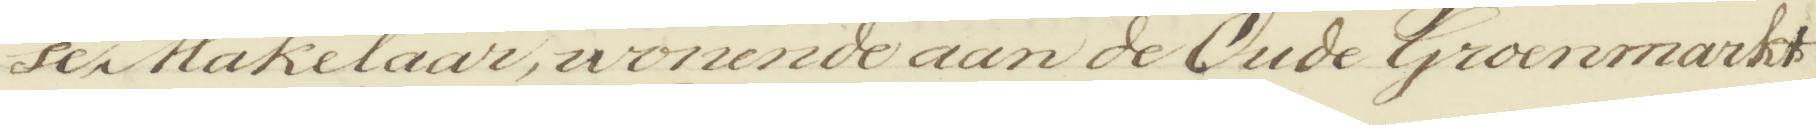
se, Makelaar, wonende aan de Oude Groenmarkt
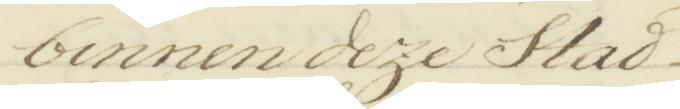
binnen deze Stad
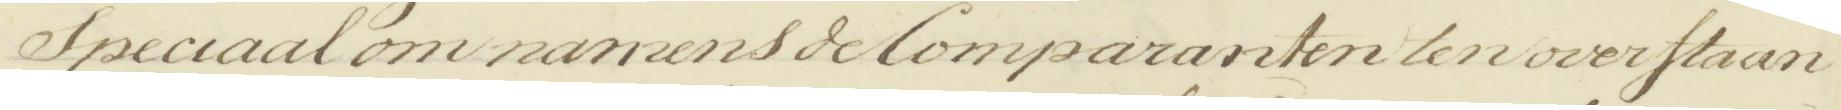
Speciaal om namens de Comparanten ten overstaan
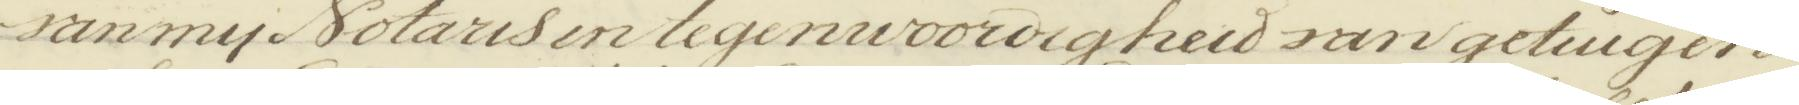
van my Notaris in tegenwoordigheid van getuigen
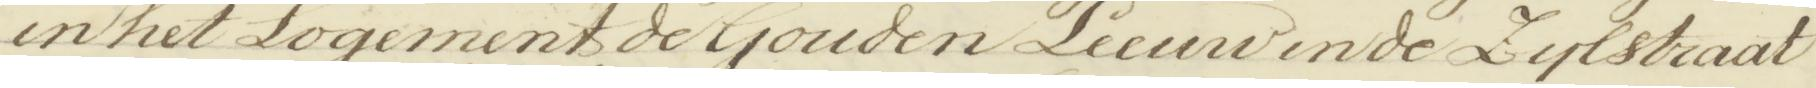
in het Logement de Gouden Leeuw in de Zylstraat
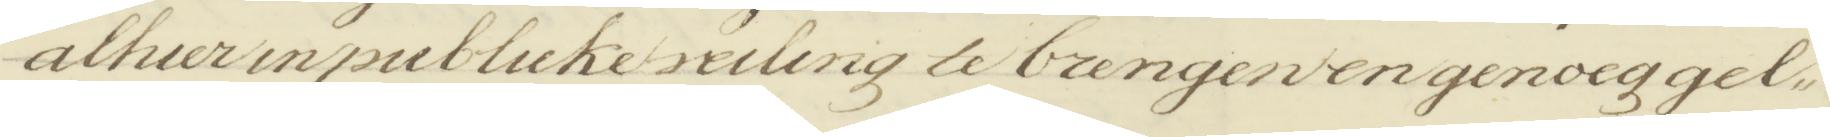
alhier in publieke veiling te brengen en genoeg gel„
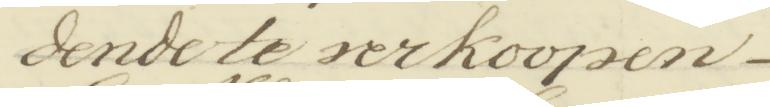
dende te verkoopen-
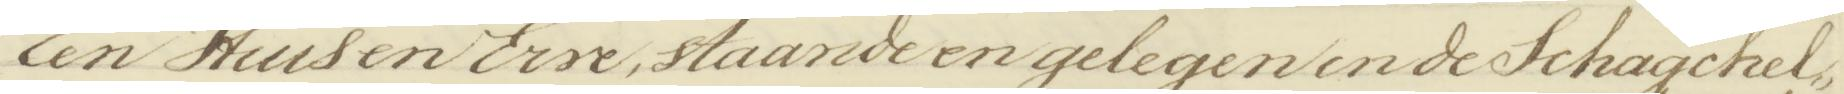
Een Huis en Erve, staande en gelegen in de Schagchel„
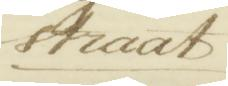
straat
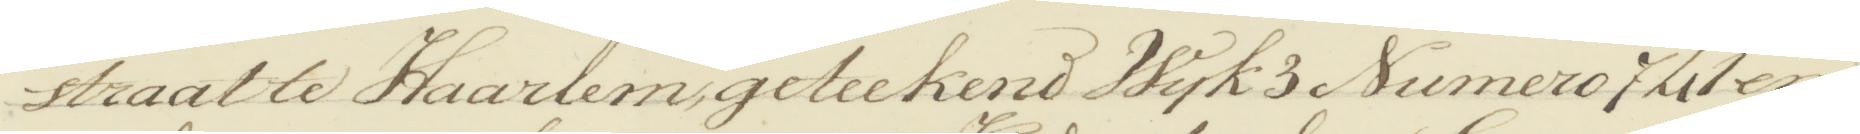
straat te Haarlem, geteekend Wyk 3 Numero 741 en
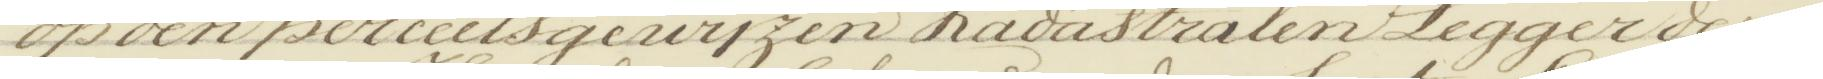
op den perceelsgewyzen kadastralen Legger der
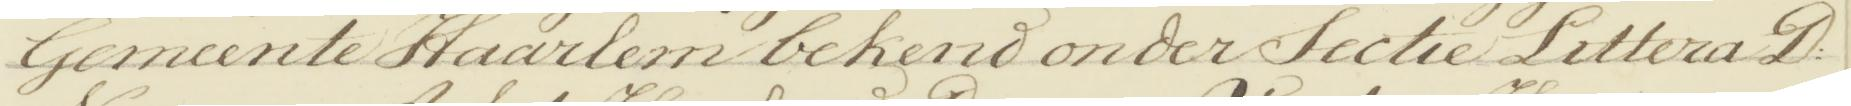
Gemeente Haarlem bekend onder Sectie Littera D:
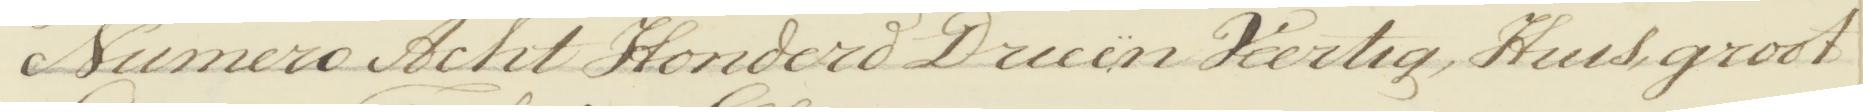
Numero Acht Honderd Drieën Veertig, Huis, groot
